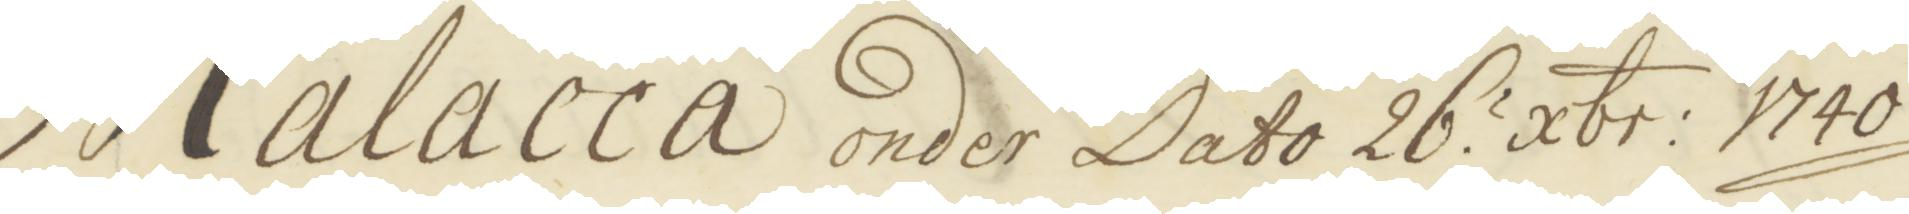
Van Malacca onder Dato 26:' xbr: 1740
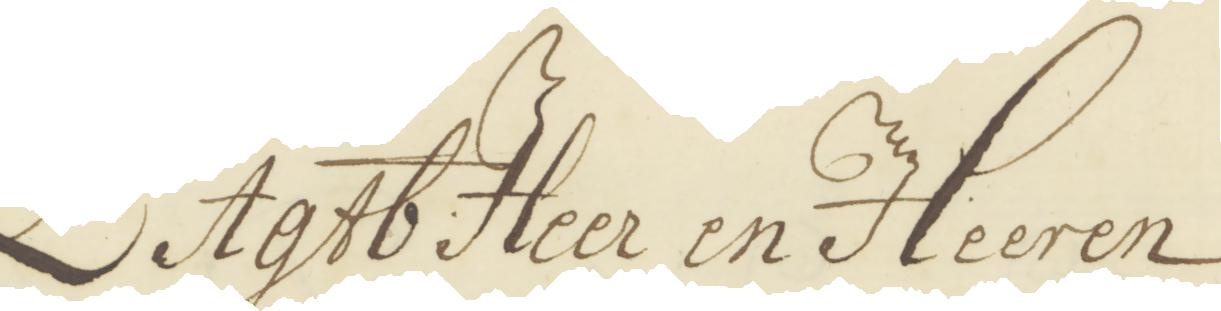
E.E Agtb Heer en Heeren.
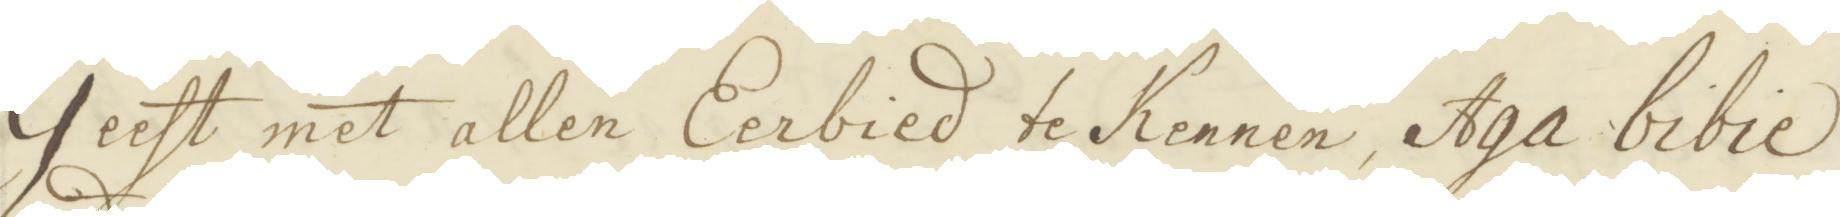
Geeft met allen Eerbied te kennen, Aga bibie
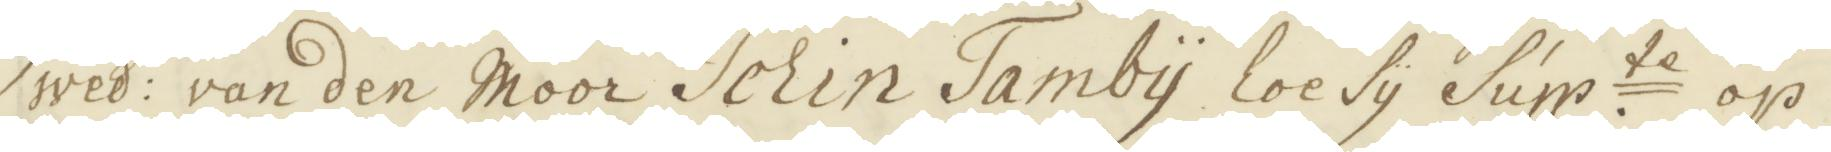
wed: van den moor Tchin Tambij hoe sij supp=te op
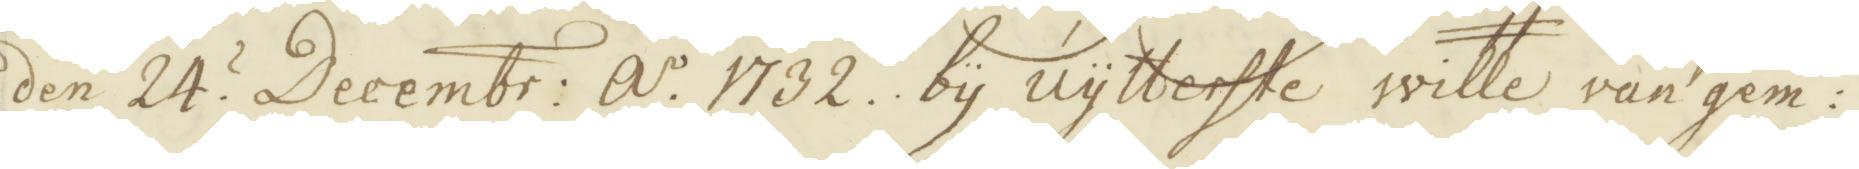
den 24.' Decembr: a:o 1732. bij uijtterste wille van gem:
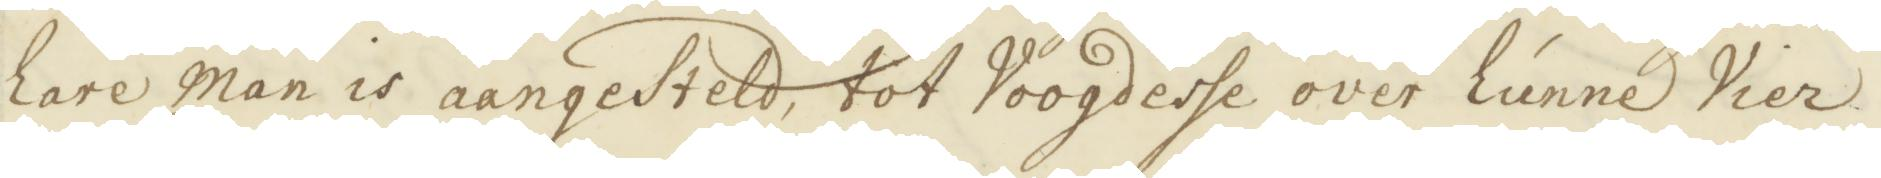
hare man is aangesteld, tot voogdesse over hunne vier
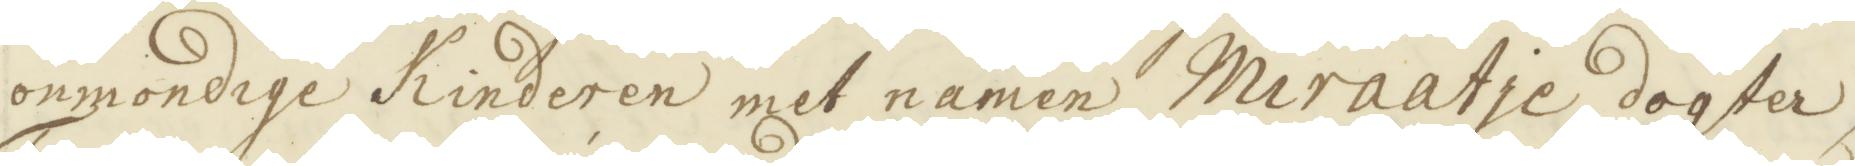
onmondige kinderen met namen Miraatje dogter,
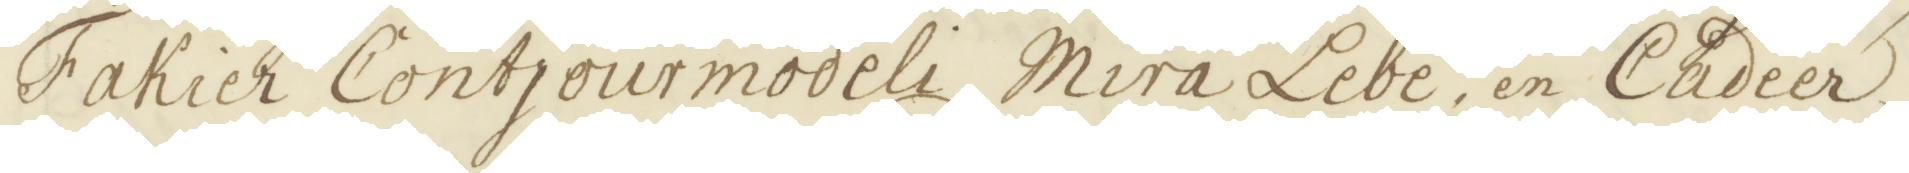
Fakier Contjourmodeli, Mira Lebe, en Cadeer
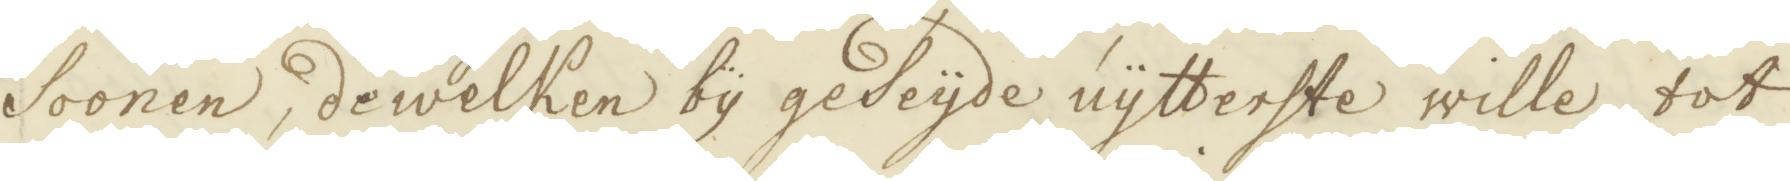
soonen, dewelken bij geseijde uijtterste wille tot
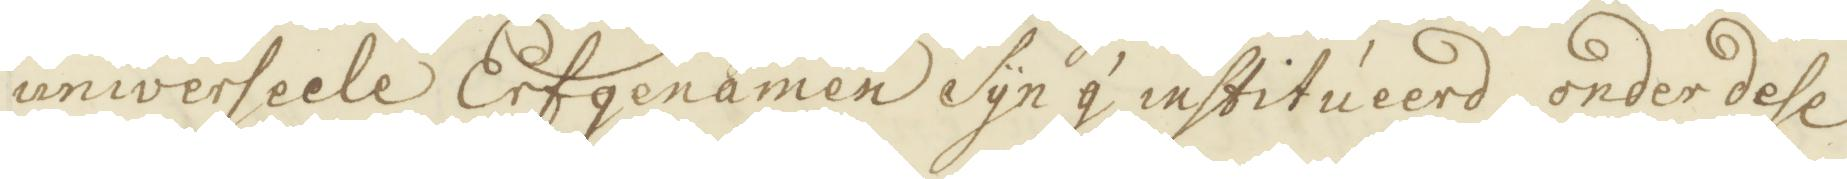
umiverseele Erfgenamen sijn g’institueerd, onder dese
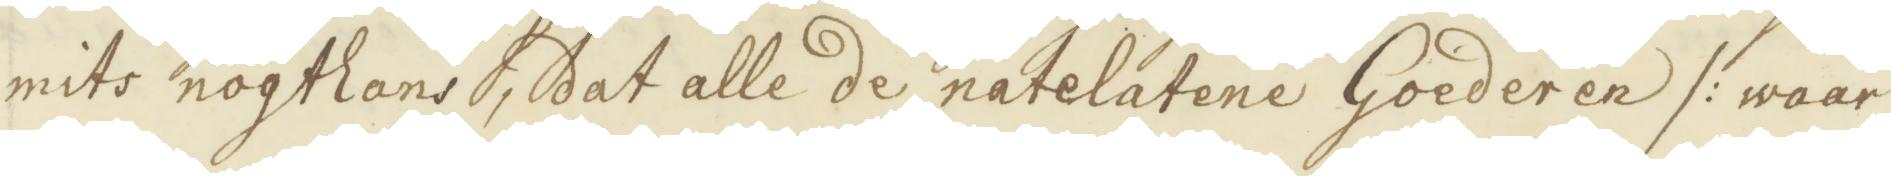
mits nogthanst, dat alle de natelatene Goederen /:waar
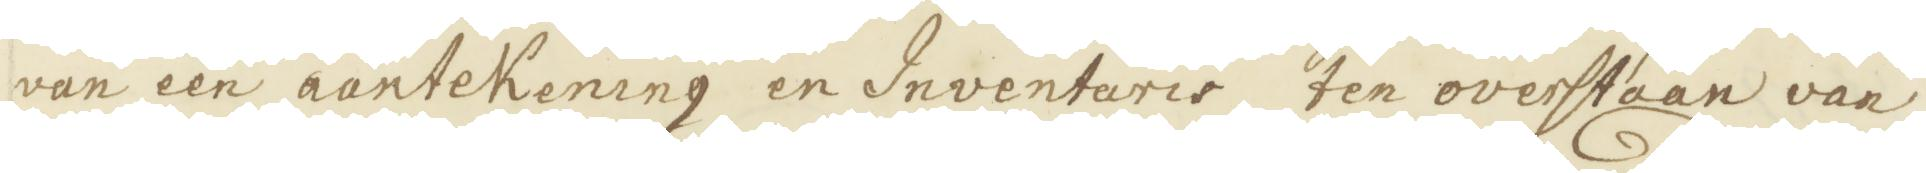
van een aantekening en jnventaris ten overstaan van
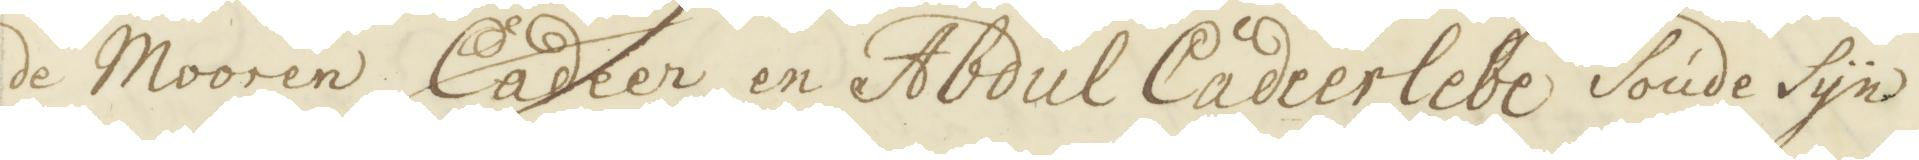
de Mooren Cadeer en Abdul Cadeerlebe soude sijn
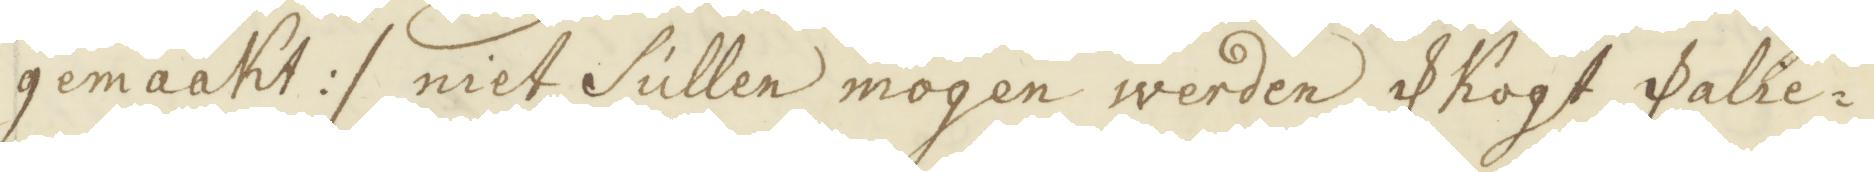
gemaakt :/ niet sullen mogen werden verkogt veralie=
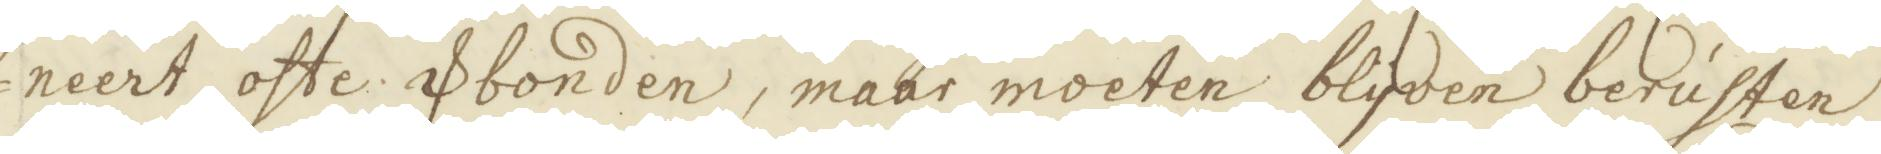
=neert, ofte verbonden, maar moeten blijven berusten
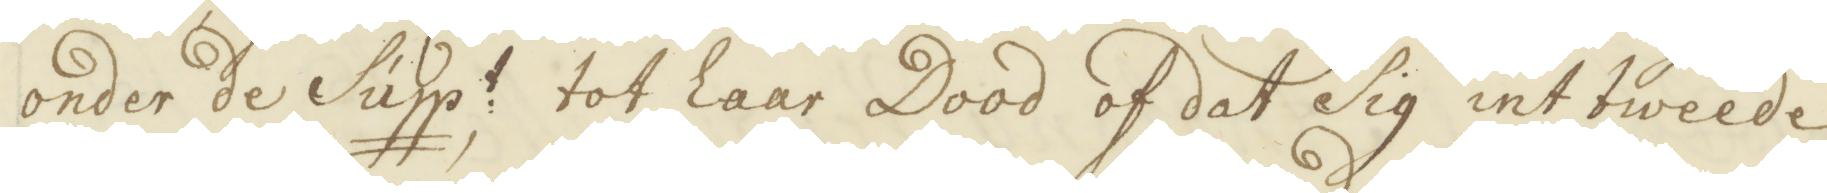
onder de supp:t tot haar Dood of dat sig in't tweede
